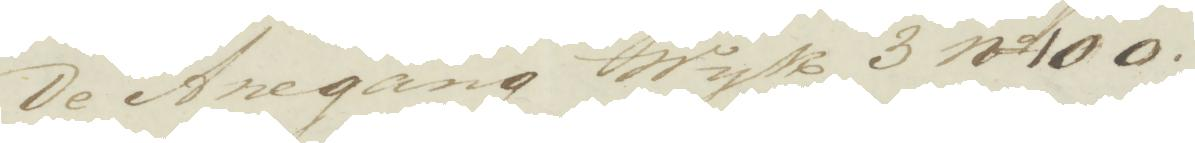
de Anegang wijk 3 n=o 100.
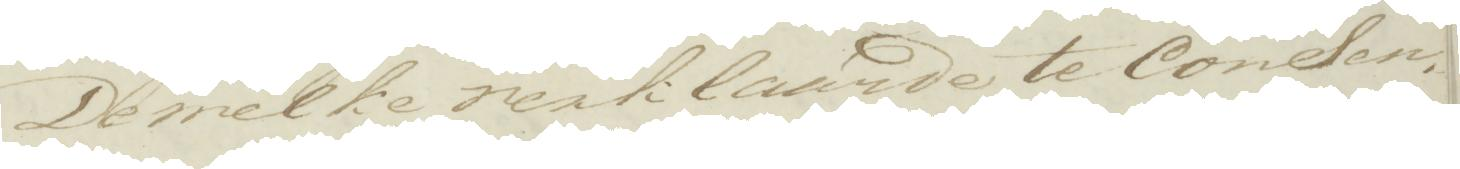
Dewelke verklaarde te consen„
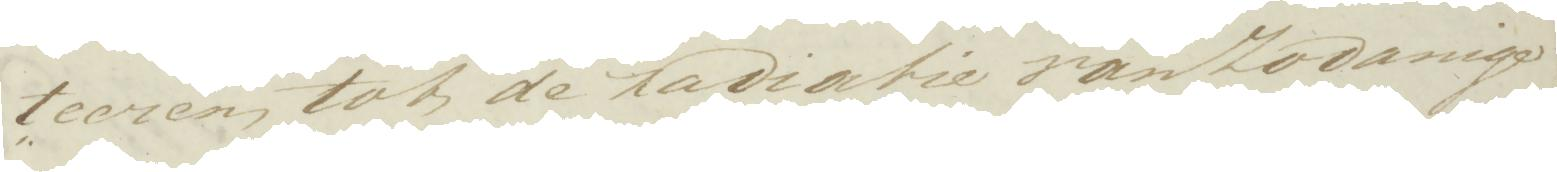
teeren, tot de radiatie van zodanige
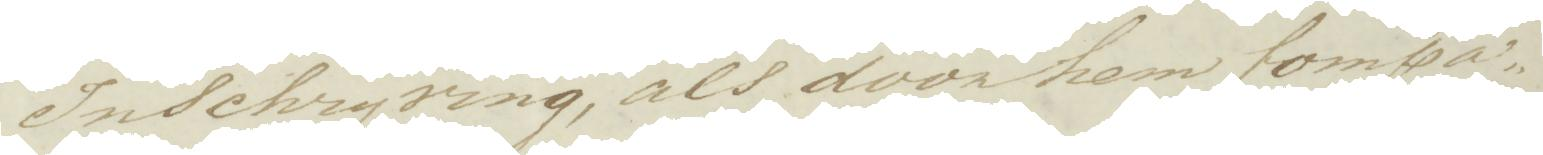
Inschrijving, als door hem Compa„
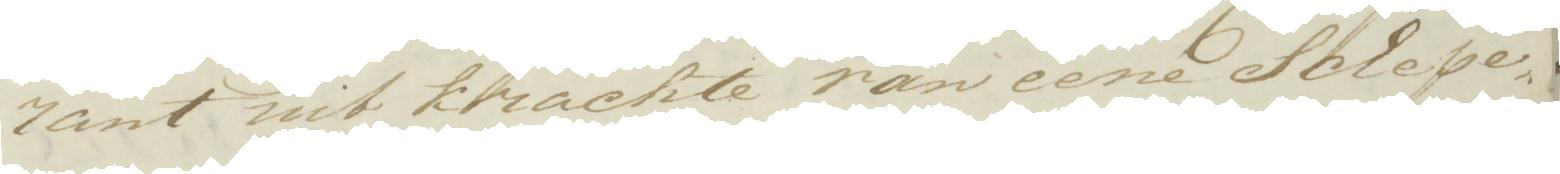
rant uit krachte van eene Schepe„
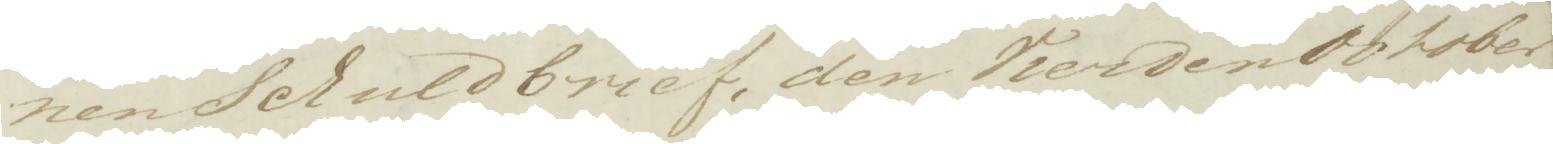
nen Schuld brief, den vierden October
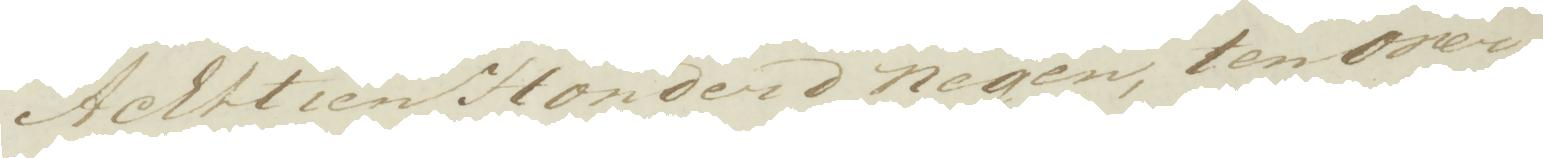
Achttien Honderd negen, ten over
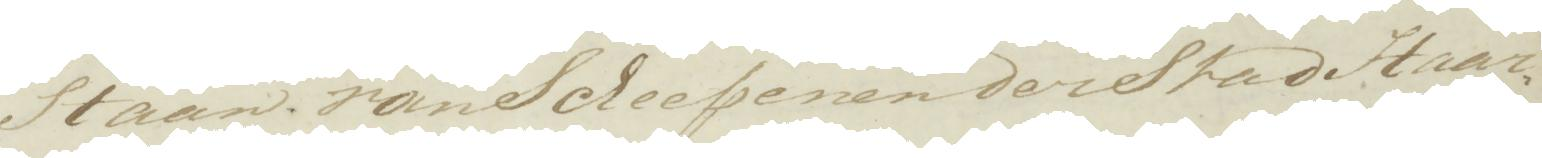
staan van Scheepenen der stad Haar„
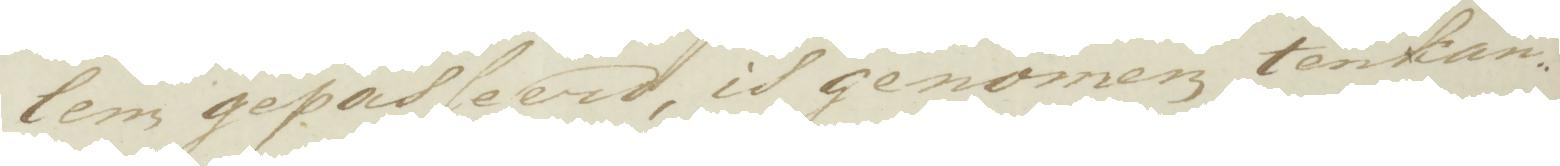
lem gepasseerd, is genomen ten kan„
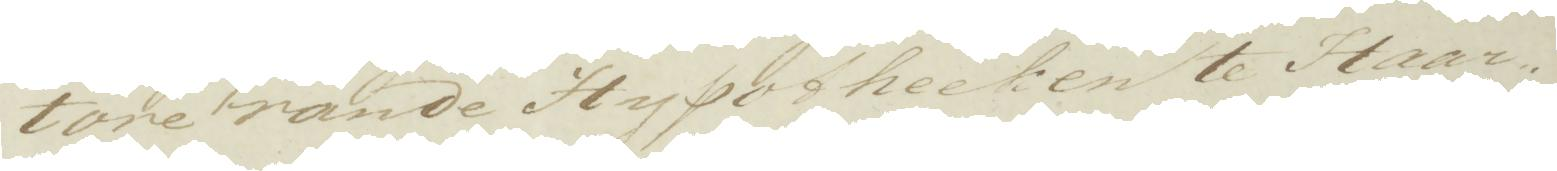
tone van de Hijpotheeken te Haar„
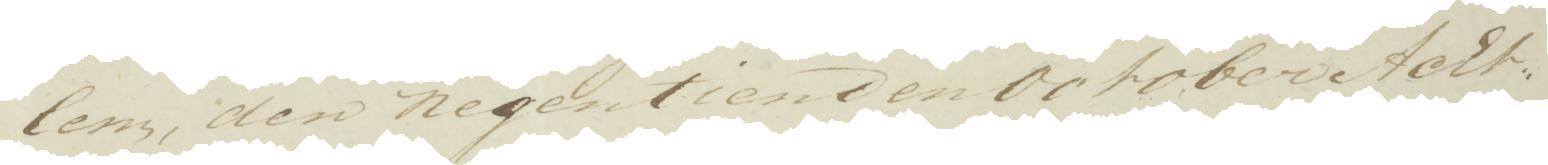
lem, den negentienden October Acht„
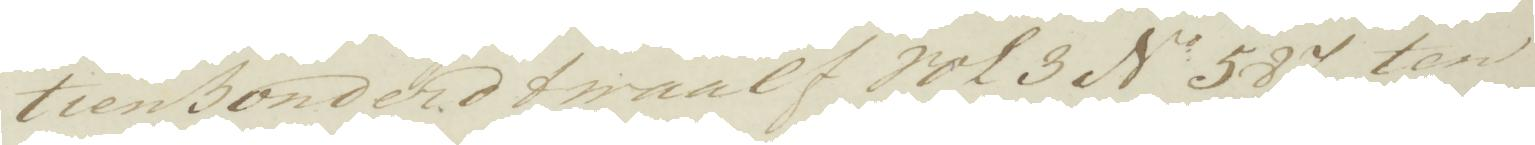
tienhonderd twaalf vol 3 N=o 587 ten
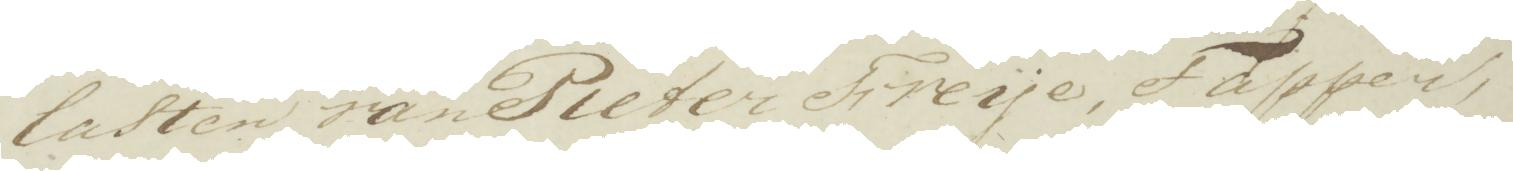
lasten van Pieter Freije, Tapper,
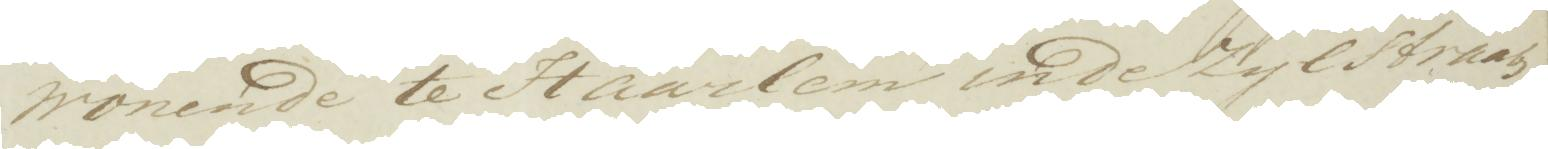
wonende te Haarlem in de Zijlstraat,
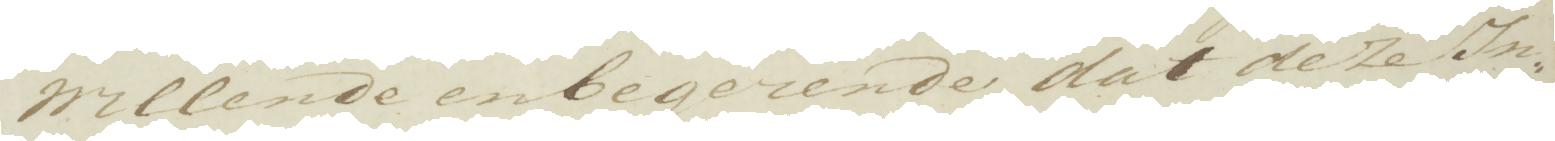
willende en begerende dat deze In„
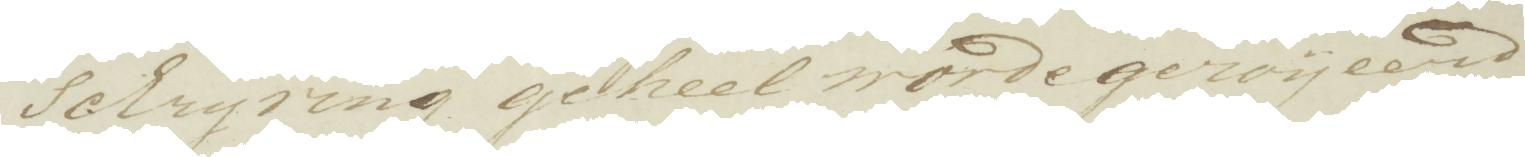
schrijving geheel worde geroijeerd
